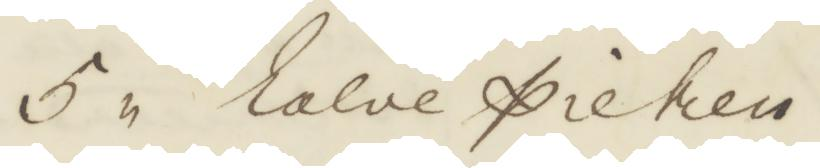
5 „ halve pieken
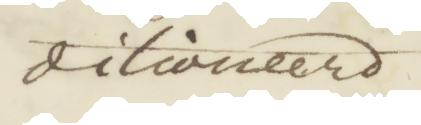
ditioneerd
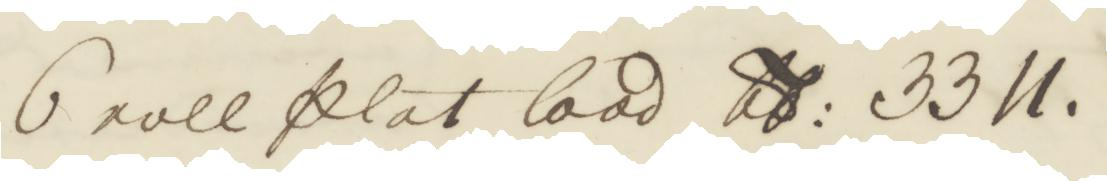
6 roll plat lood lb: 3311.
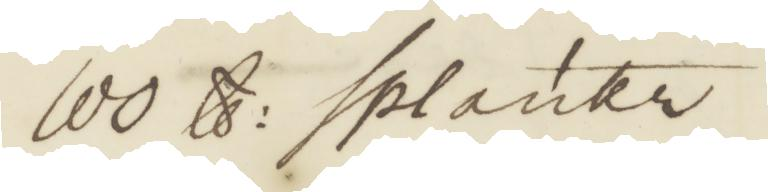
100 lb: splauter
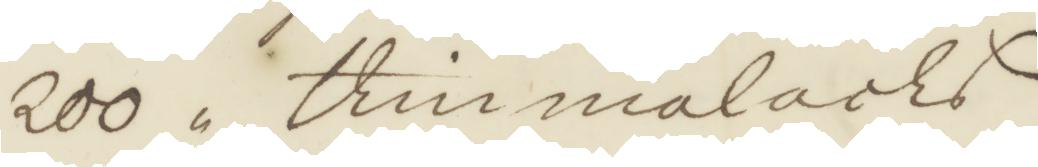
200„ thin malachs
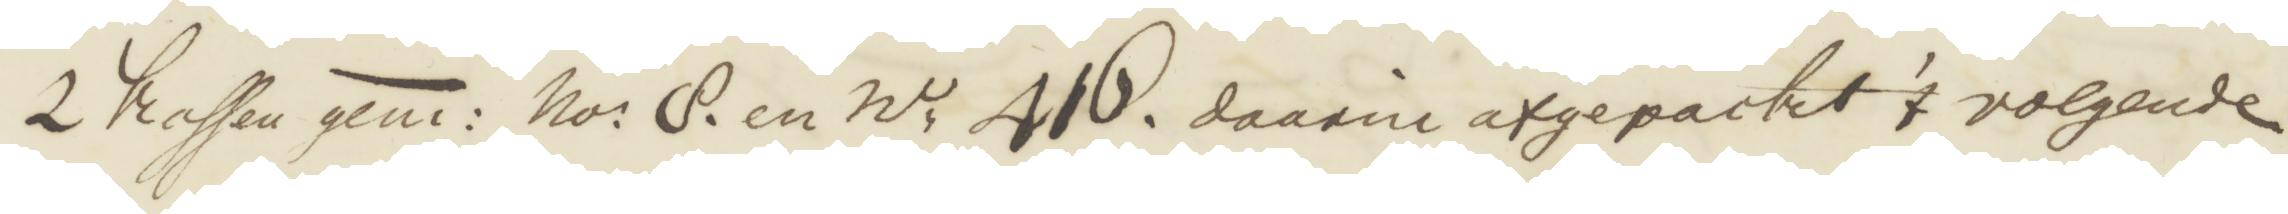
2 kassen gem: No: 8. en N„o 416. daarin afgepackt ’t volgende
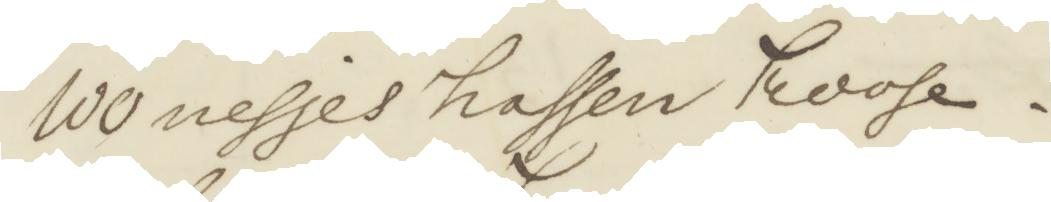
100 nesjes hassen koose
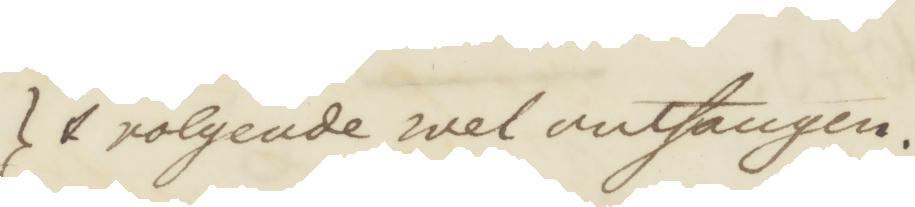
t volgende wel ontfangen.
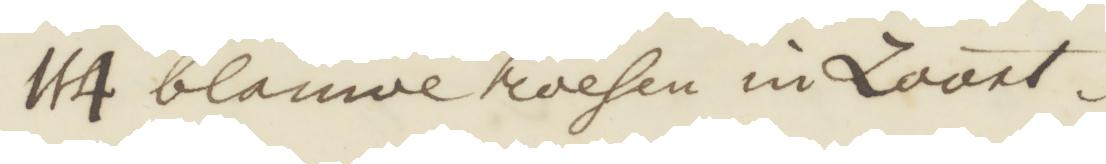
114 blauwe koesen in zoort
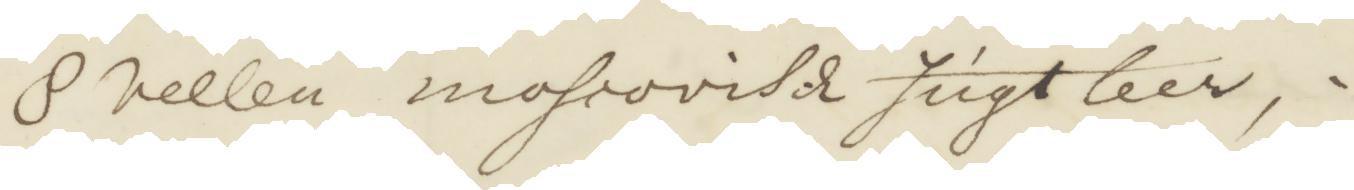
8 vellen moscovisch jugtleer,
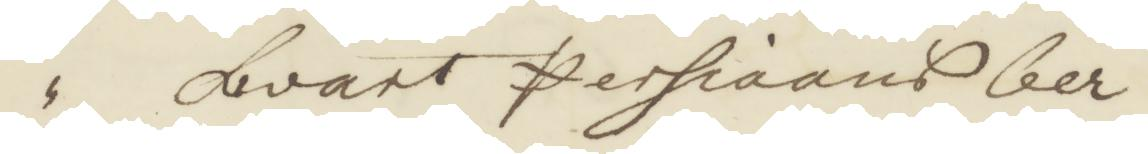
6 „ zwart persiaans leer
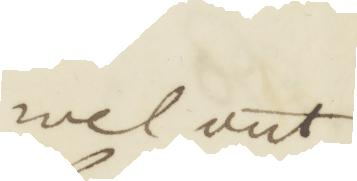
wel ont
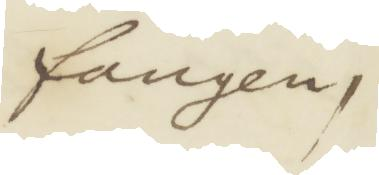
fangen,
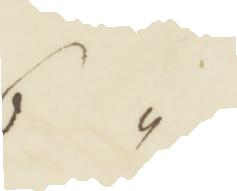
6 „ rood „ „ „
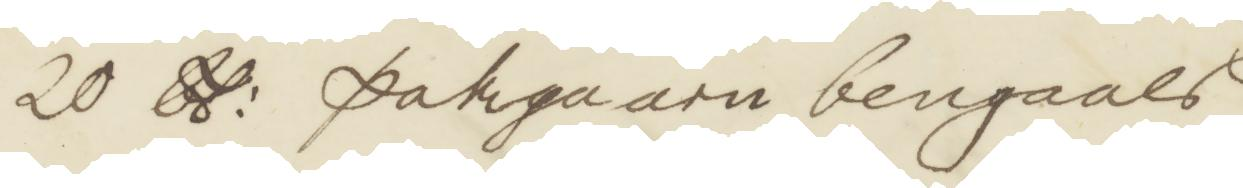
20 lb: pakpaarn bengaals
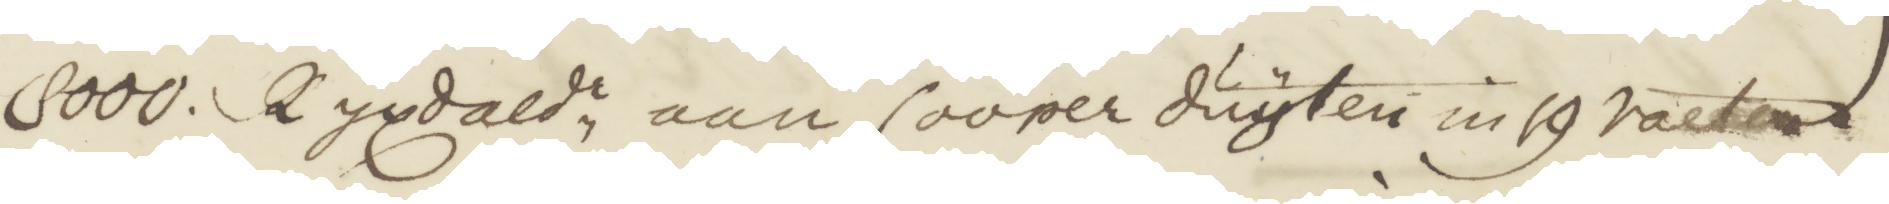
8000. Rijxdald„r aan Cooper duijten in 19 vaeten
